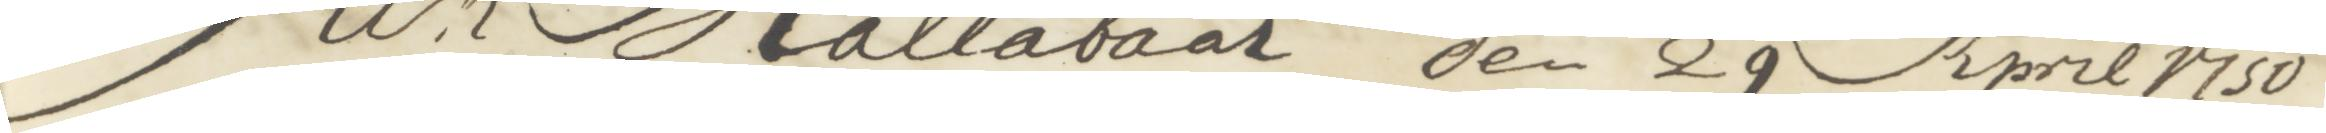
Van Mallabaar den 29 April 1750
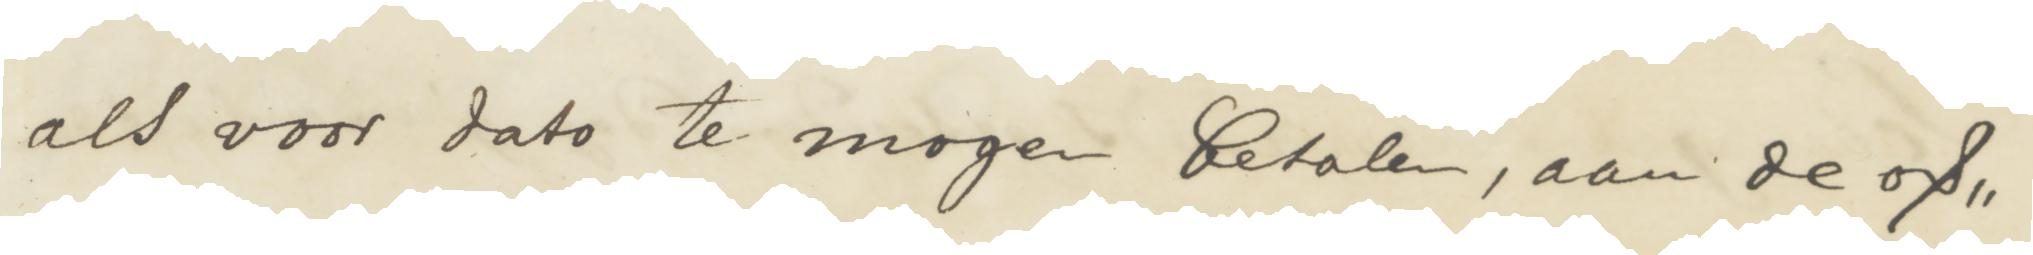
als voor dato te mogen betalen, aan de over„
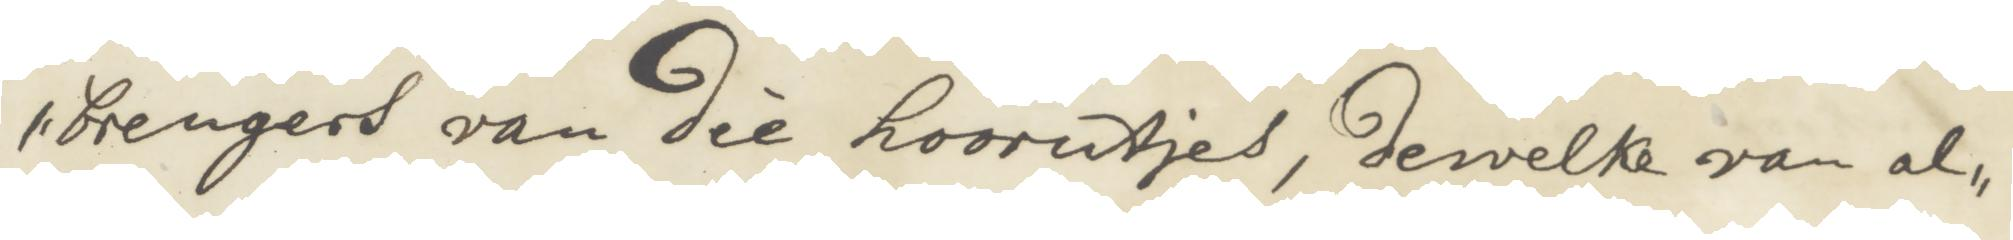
„brengers van die hoorntjes, dewelke van al„
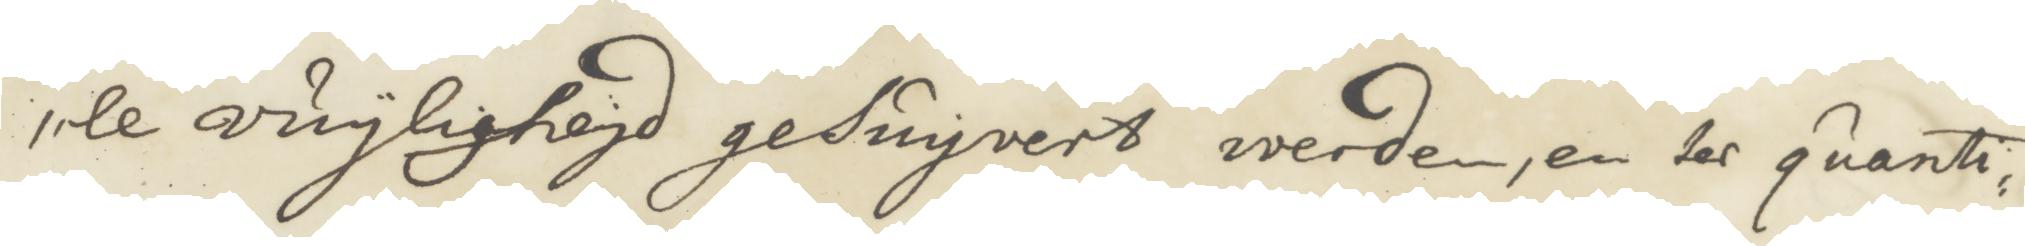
„le vuijligheijd gesuijvert werden, en ter quanti„
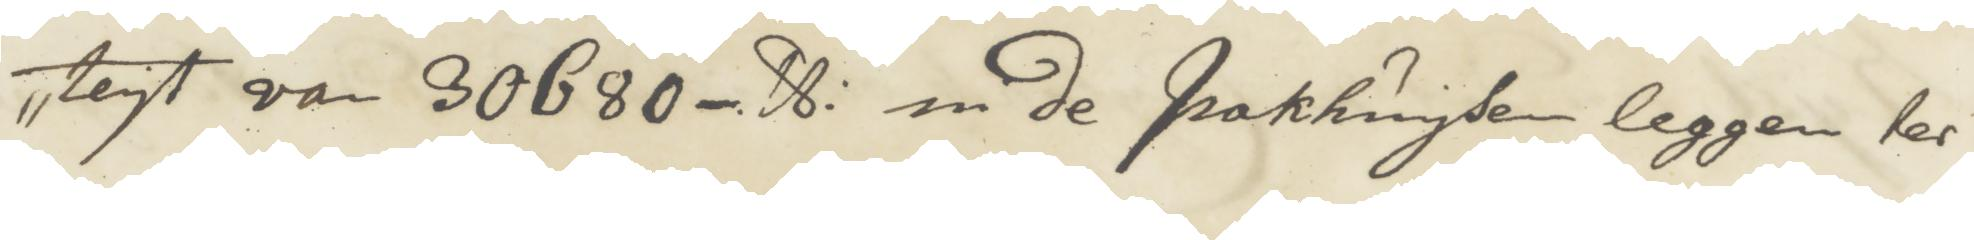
„teijt van 30680 —. lb: in de pakhuijsen leggen ter
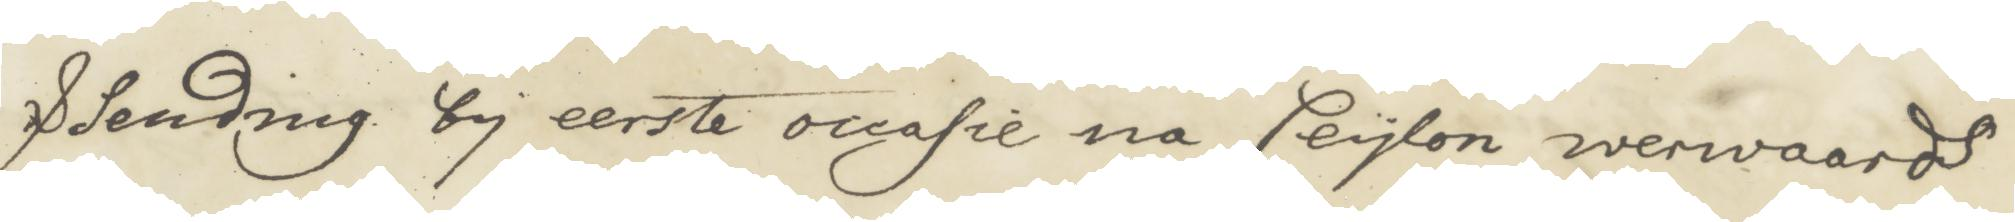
versending bij eerste occasie na Ceijlon werwaards
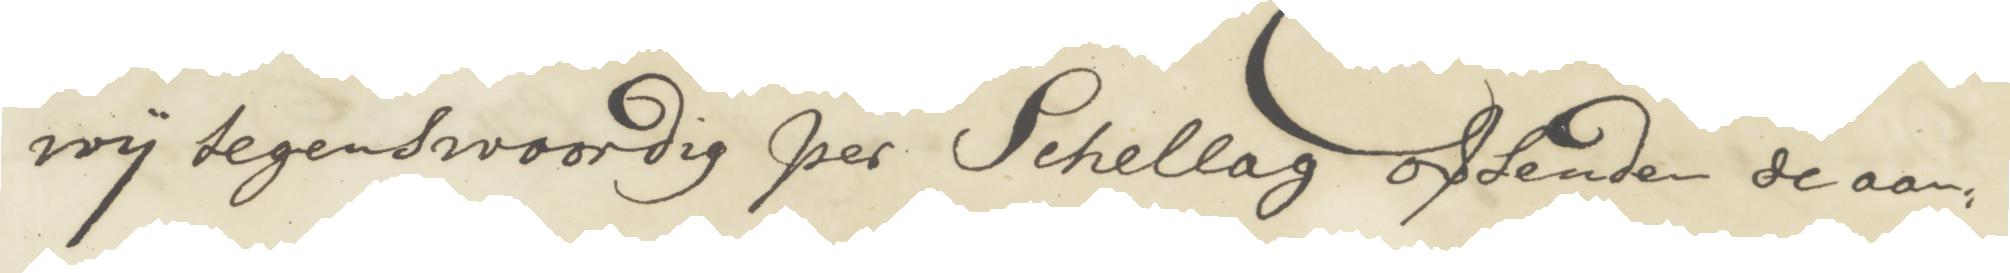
wij tegenswoordig per schellag oversenden de aan„
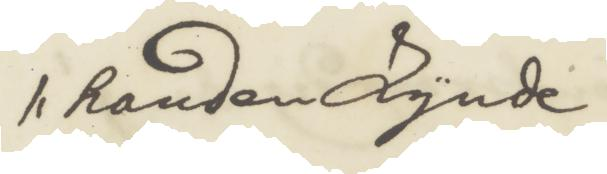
„handen zijnde
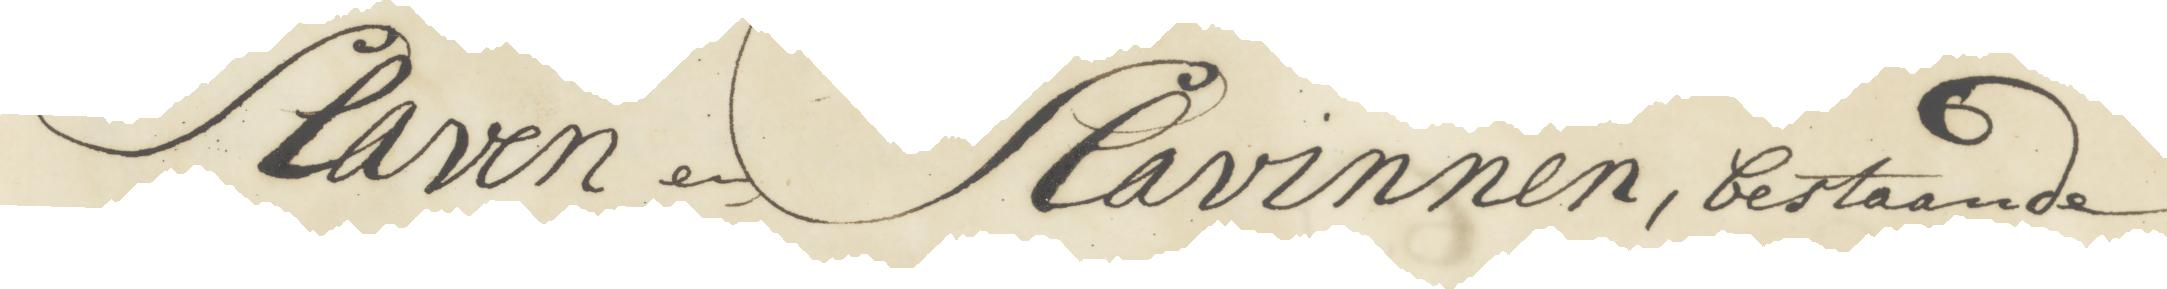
Slaven en Slavinnen, bestaande
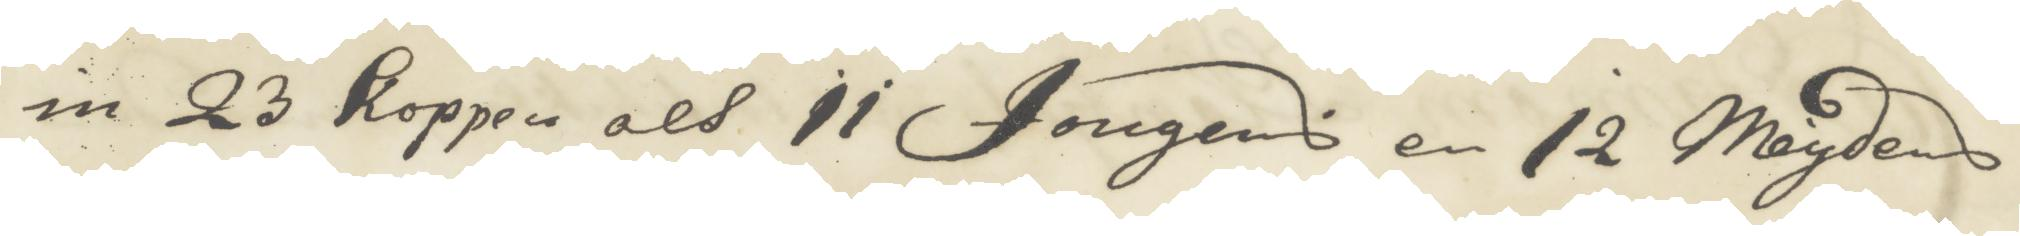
in 23 koppen als 11 Jongens en 12 Meijdens
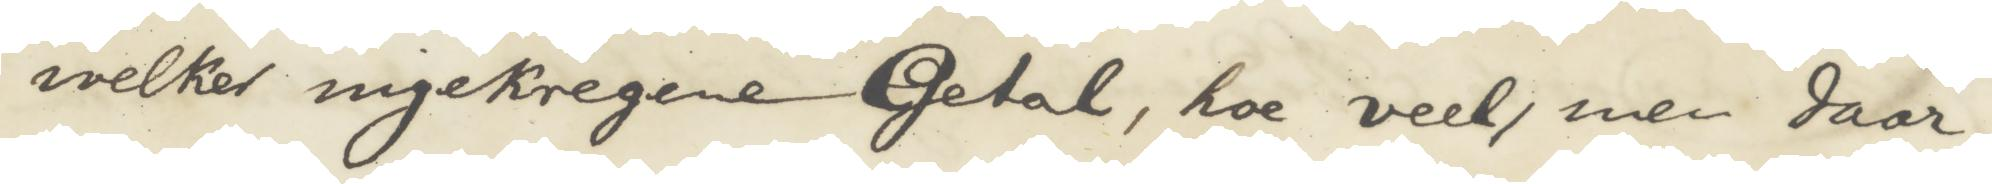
welker ingekregene Getal, hoe veel, men daar
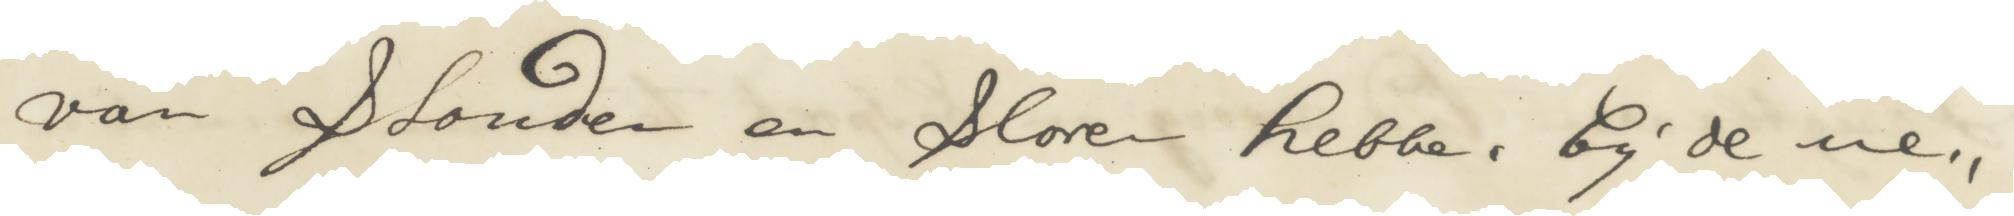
van versonden en verloren hebbe, bij de ne„
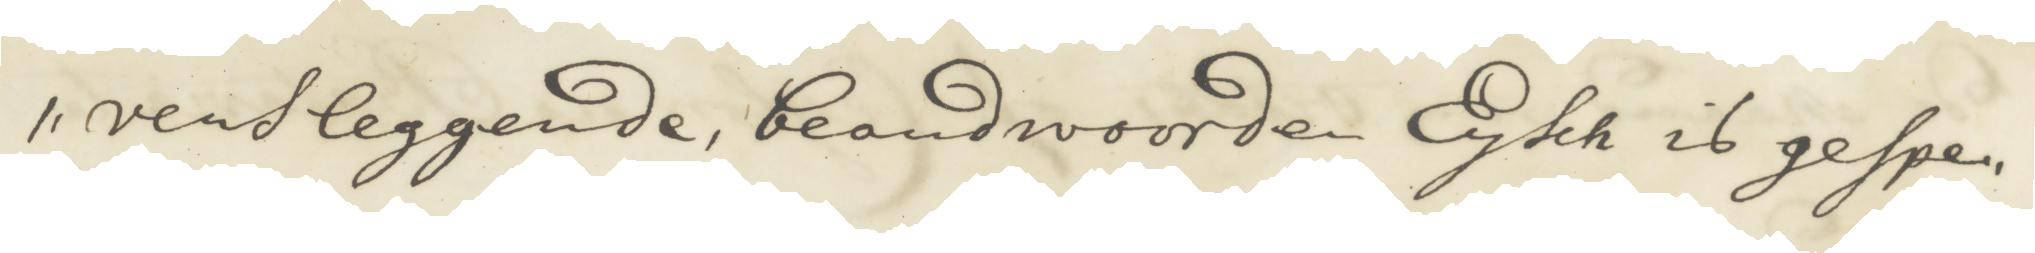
„vensleggende, beandwoorden Eysch is gespe„
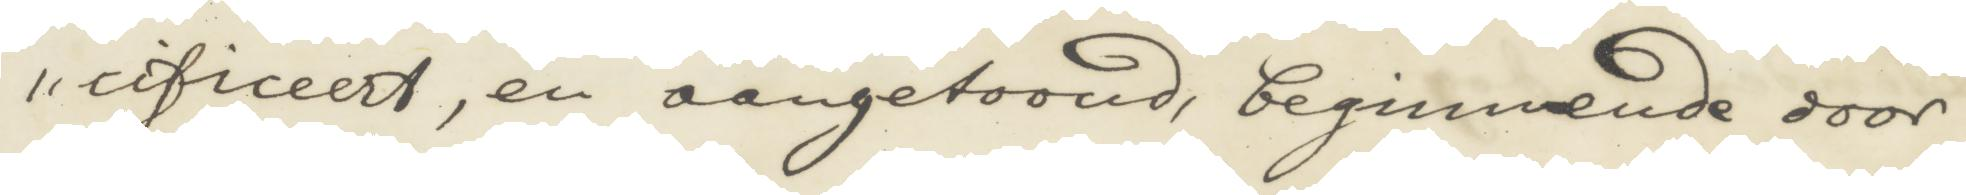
„cificeert, en aangetoond, beginnende door
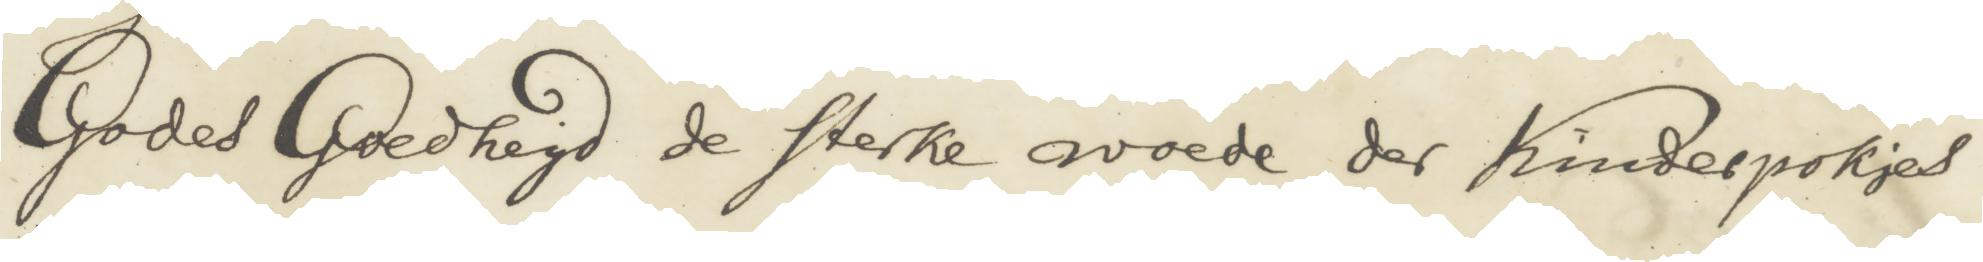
Godes Goedheijd de sterke woede der Kinderpokjes
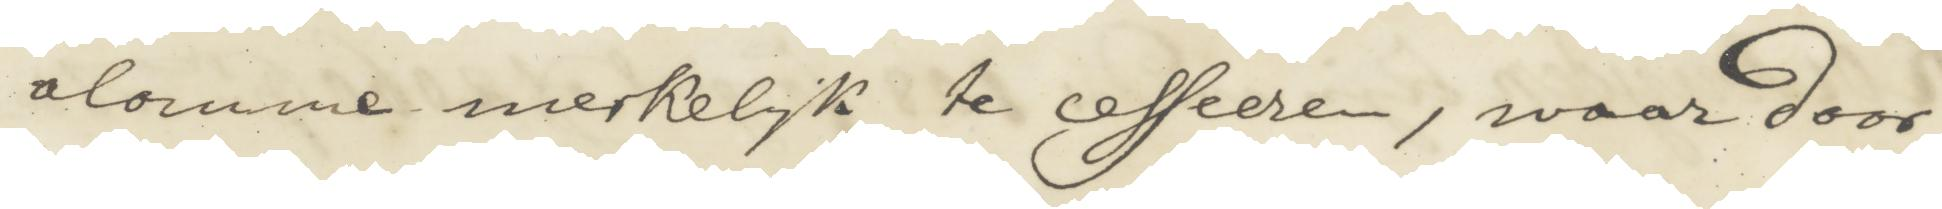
alomme merkelijk te cesseeren, waar door
